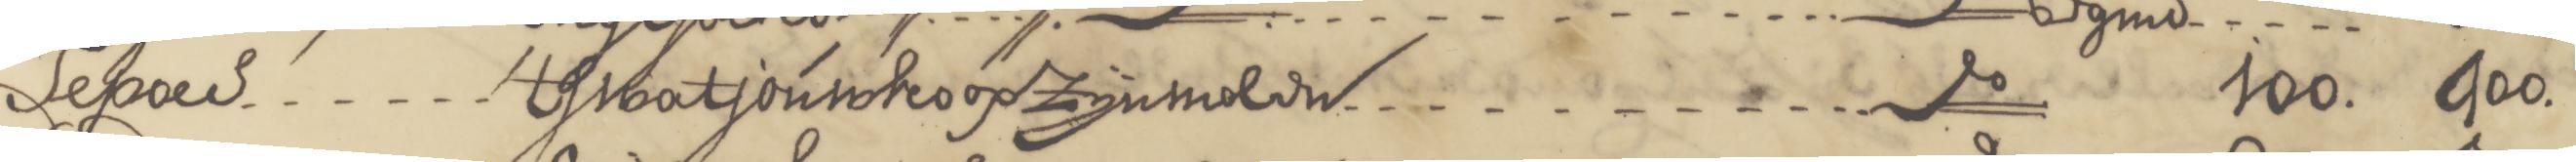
Tepoes - - - - - - 'tSwatjouwko op Zijn molen - - - - - - - - - d=o: 100. 400.
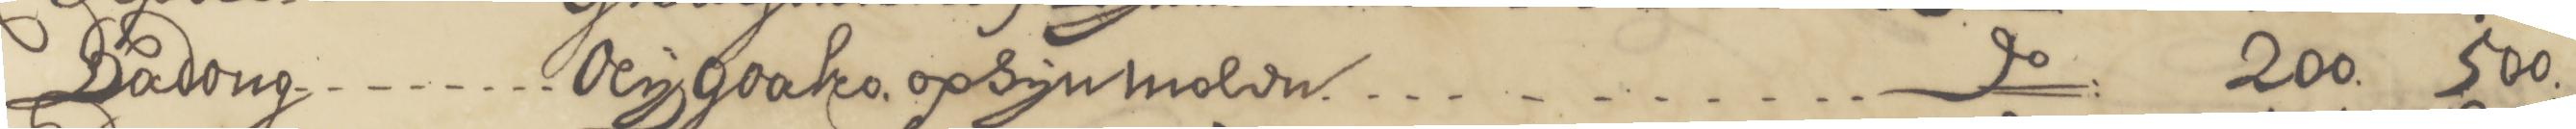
Dadong- - - - - - - - Oeij goako op sijn molen - - - - - - - - - - - - d=o: 200. 500.
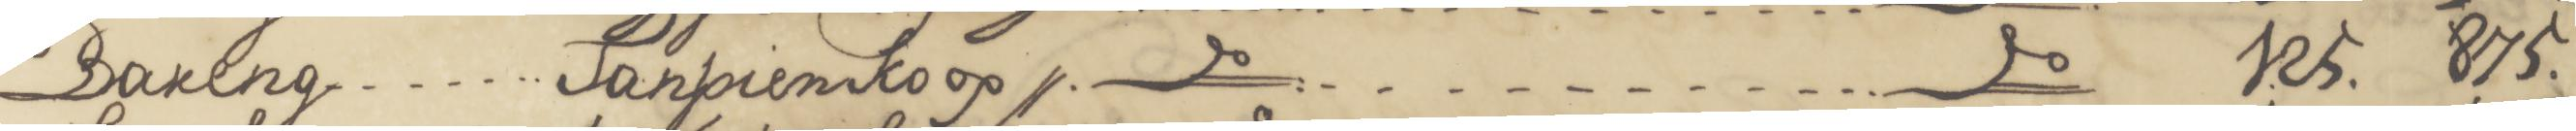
Dareng- - - - - - - Tanpieniko op „ . d=o - - - - - - - - - - - -: d=o 125. 875.
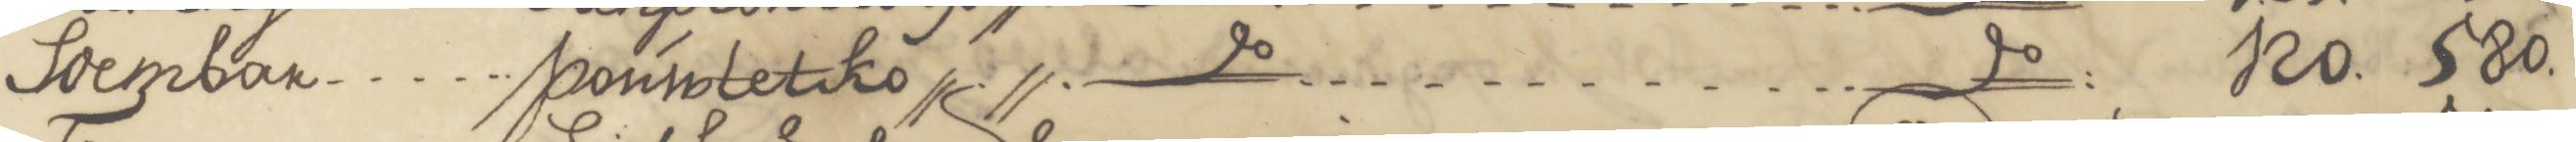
Soembar- - - - - . . pouwtetiko „ . „ . d=o - - - - - - - - - - - - d=o: 120. 580.
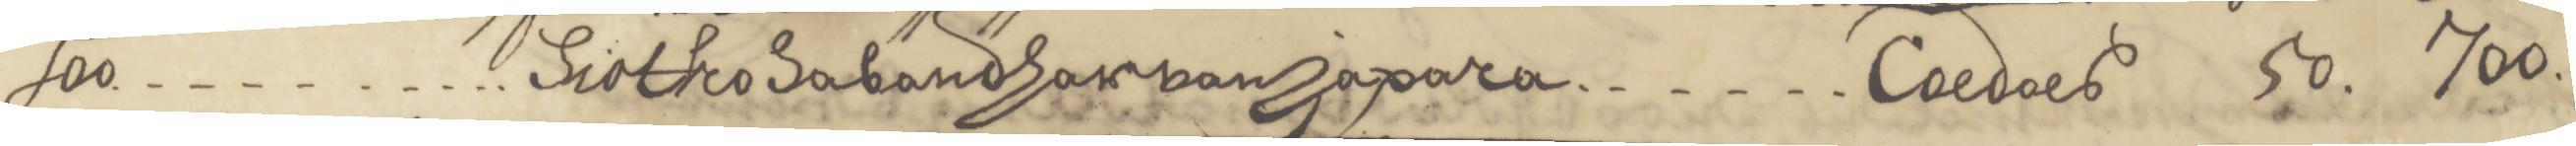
Too. - - - - - - - . . Siotko Sabandhar van Japara - - - - - - Coedoes 50. 700.
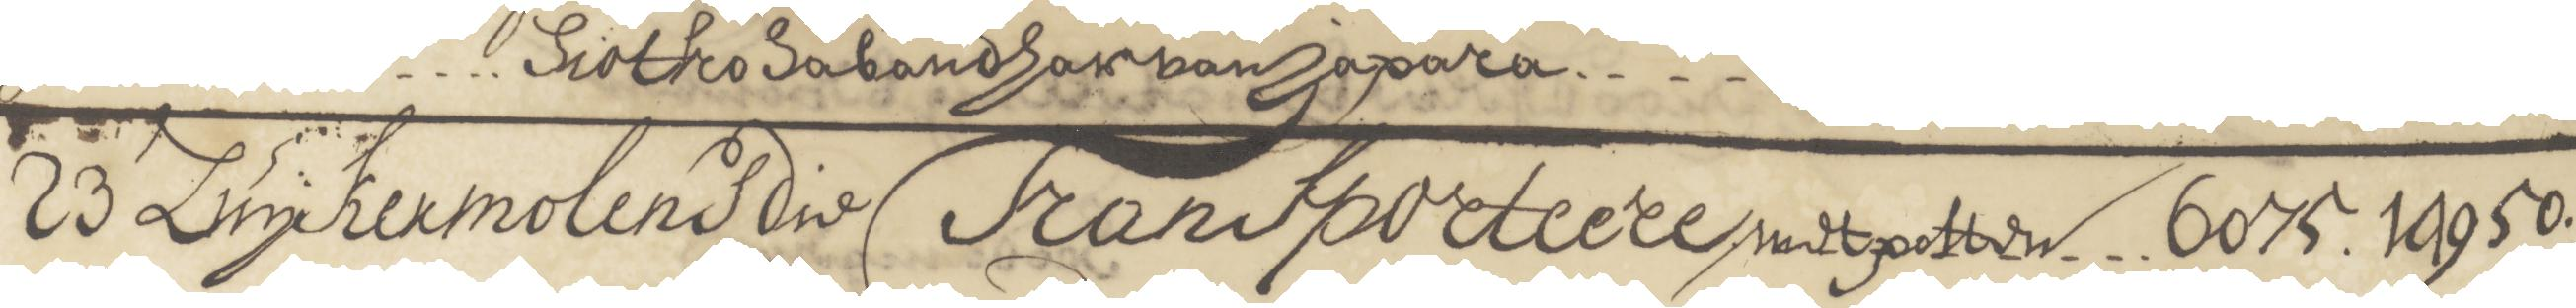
23 Zuijkermolens die Transporteere met potten - - - 6075. 14950.
